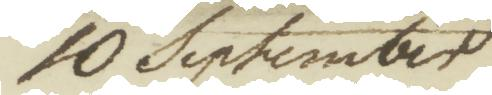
10 September
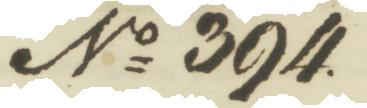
N=o 394.
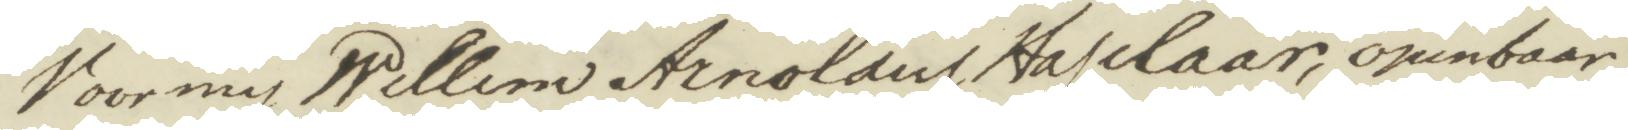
Voor mij Willem Arnoldus Haselaar, openbaar
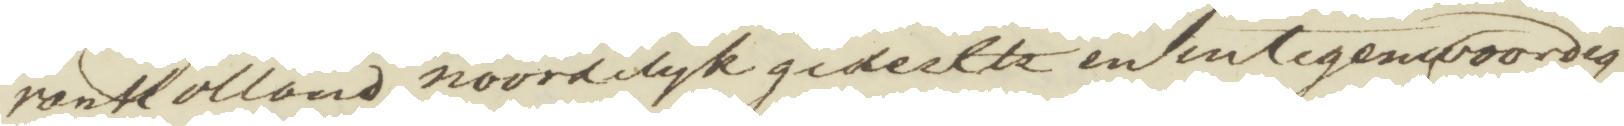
van Holland, noordelyk gedeelte en integenwoordig
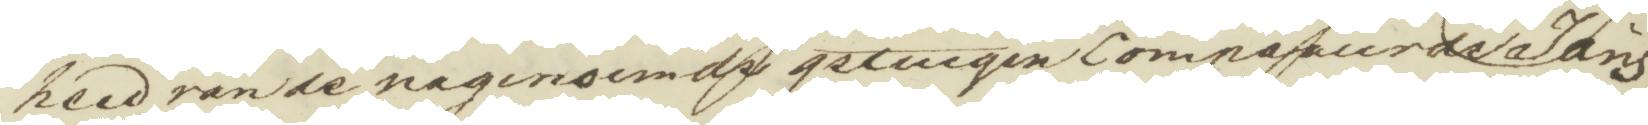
heid van de nagenoemde getuigen compareerde Jans
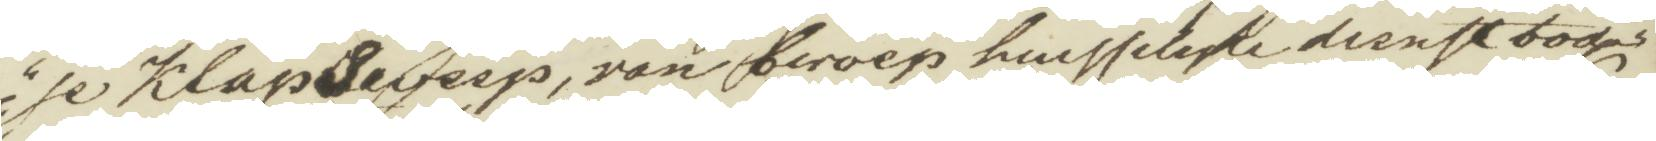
je Klapsweep, van beroep huisselyke dienst bode
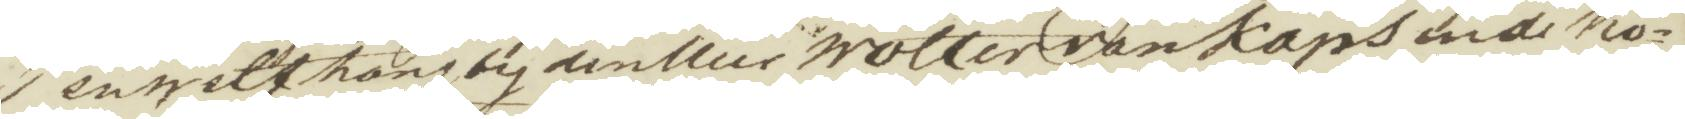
en welthans bij den Heer Wolter van Kaps inde Ko=
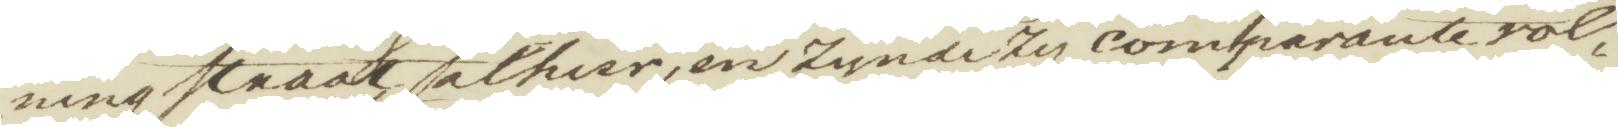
ning straat alhier, en zynde zy comparante vol„
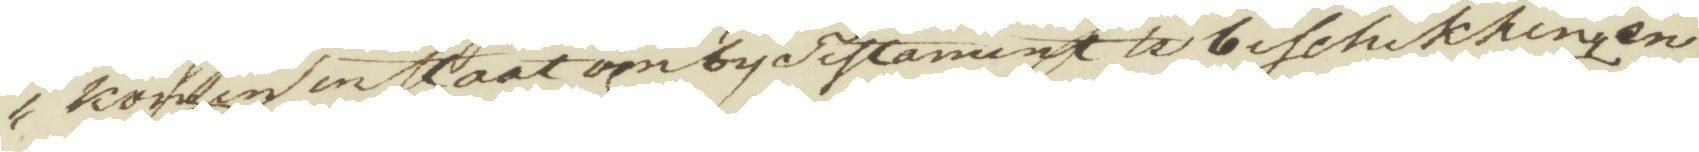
„komen in staat om by Testament te beschikken, en
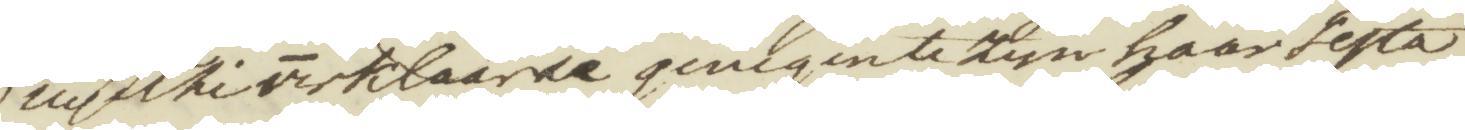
Dewelke verklaarde genegen te zyn haar Testa
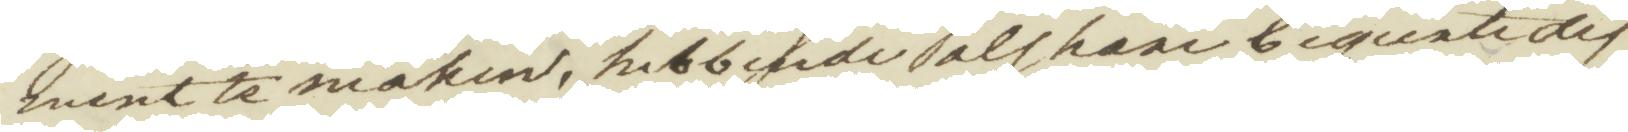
ment te maken, hebbende als hare begeerte des
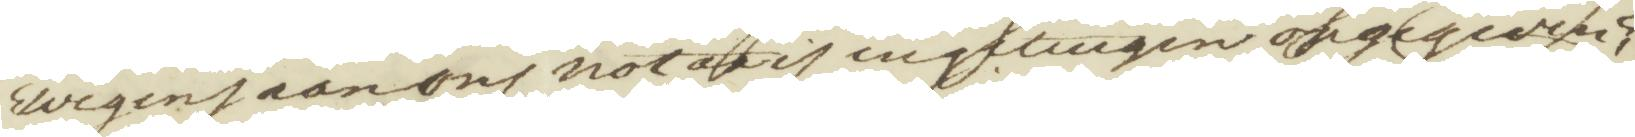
wegens aan ons notaris en getuigen opgegeven,
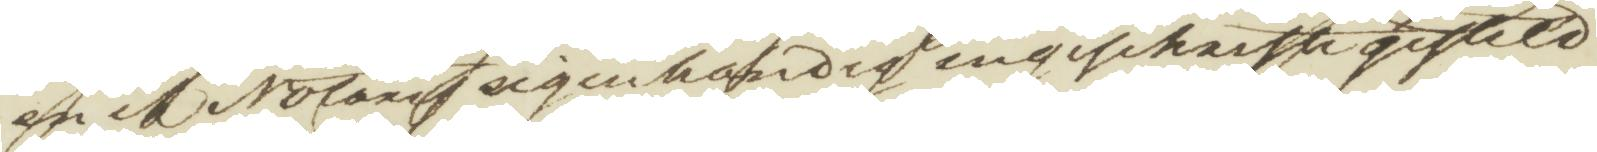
en ik Notaris eigenhandig in geschrifte gesteld
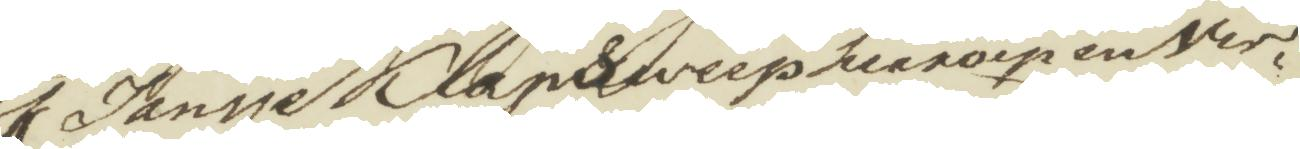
Jk Jansje Klapsweep herroep en Ver„
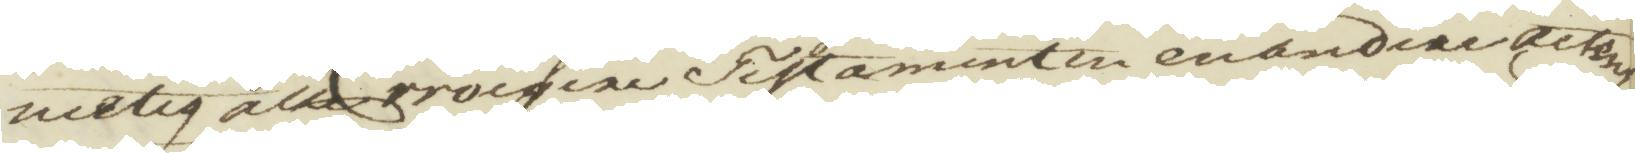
nietig alle vroegere Testamenten en andere actens
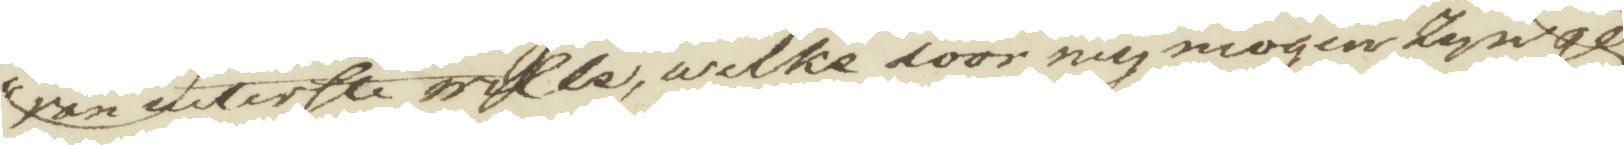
van uiterste wille, welke door my mogen zyn ge
